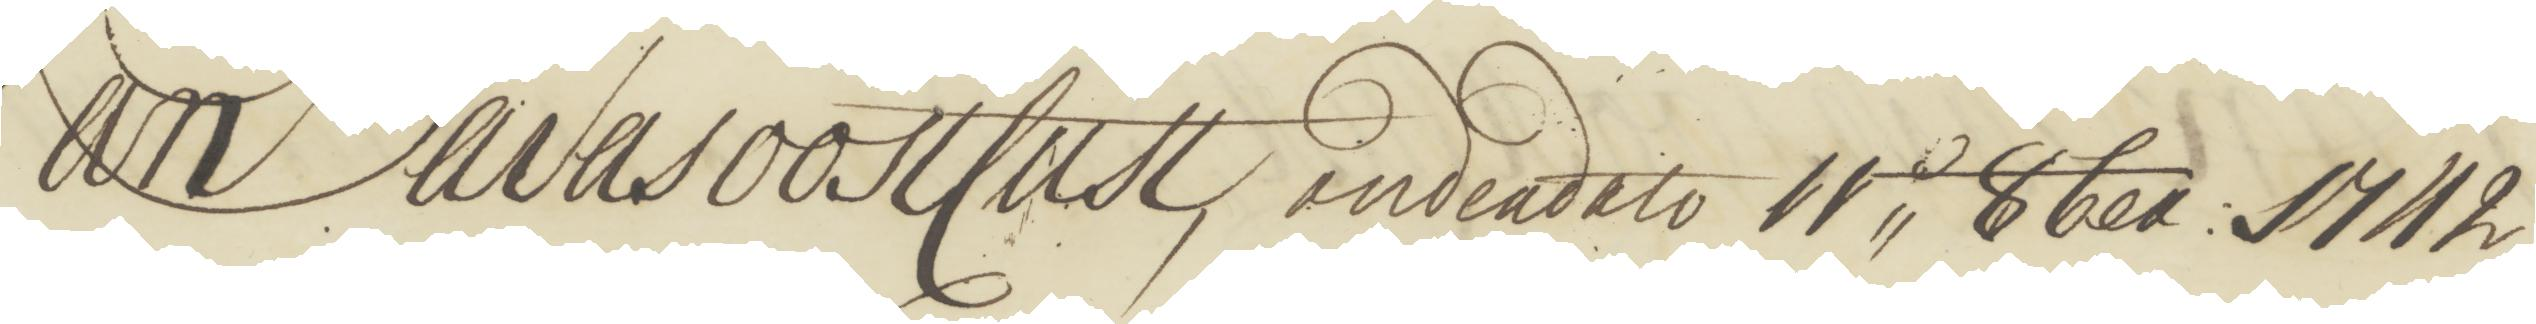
Van Iavas oostCust, onderdato 11„e 8ber: 1742
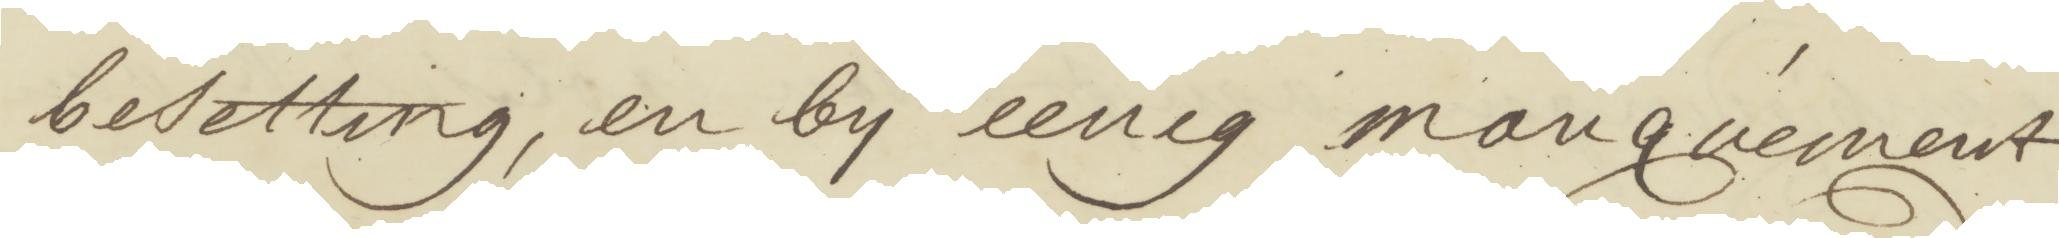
besetting, en bij eenig manquement
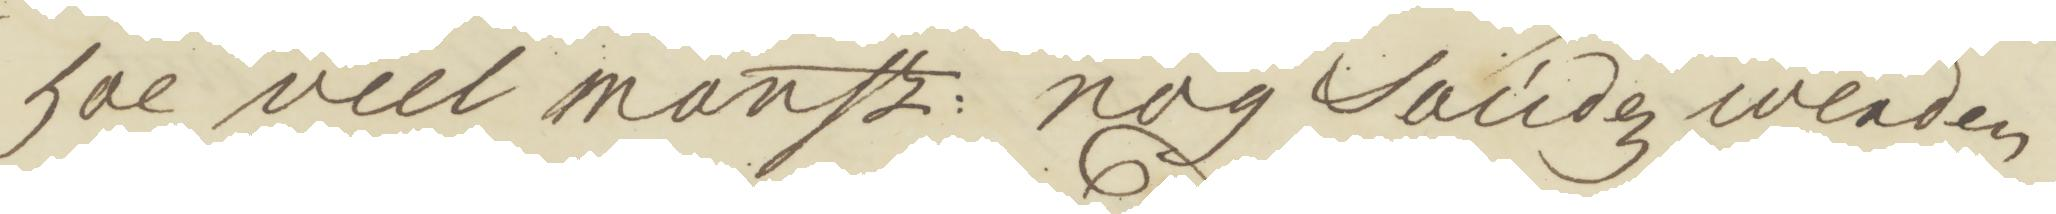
hoe veel mansz: nog souden werden
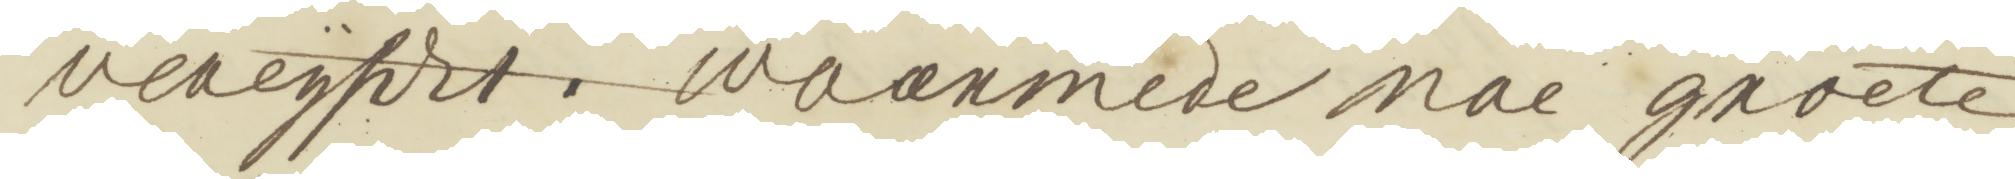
vereijscht, waarmede nae groete
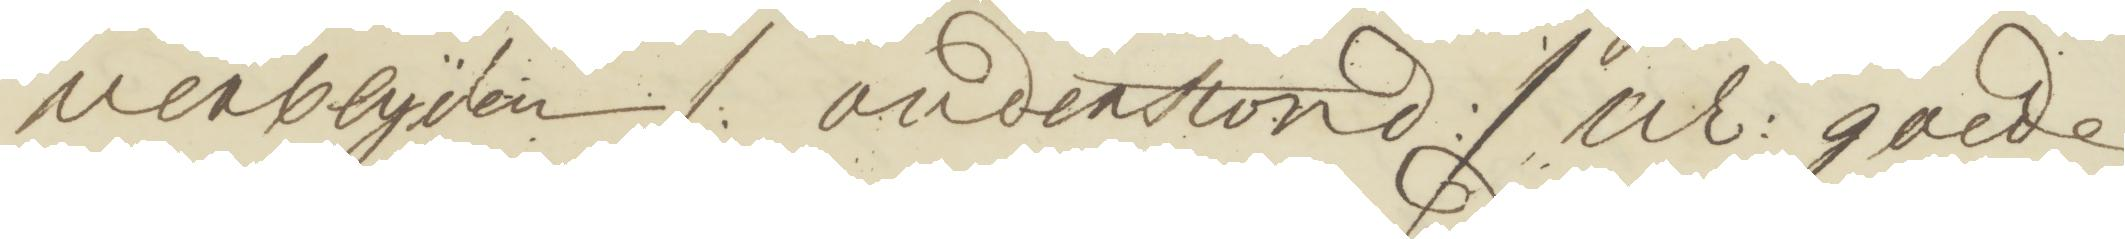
verblijven /:onderstond:/ uE: goede
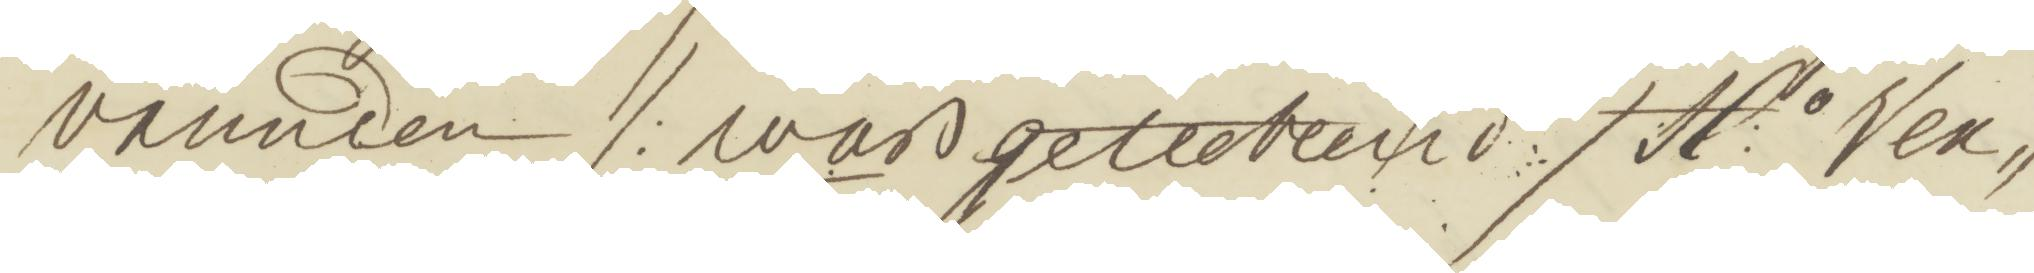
vrunden /:was geteekend:/ H:o Ver
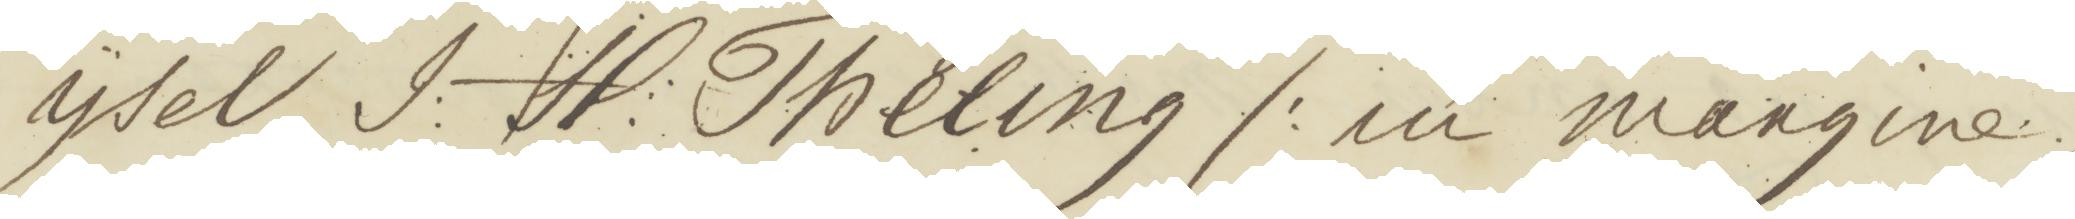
ijsel, I: H: Theling /: in margine
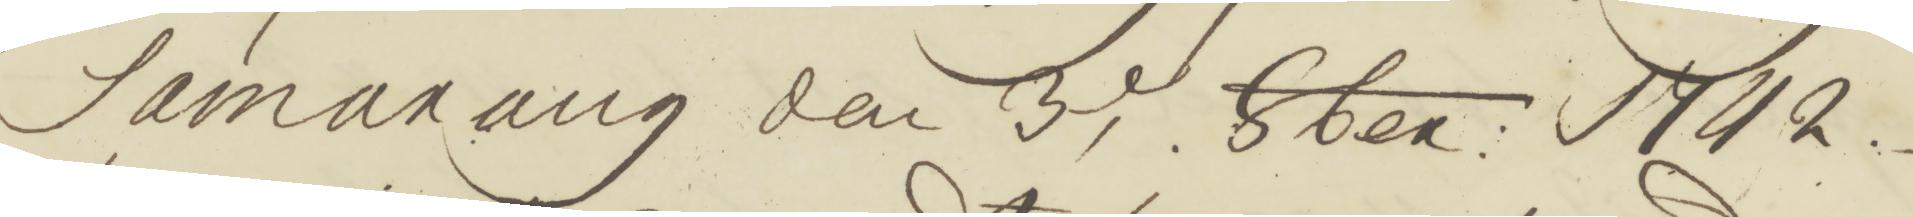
samarang den 3,e 8ber: 1742.
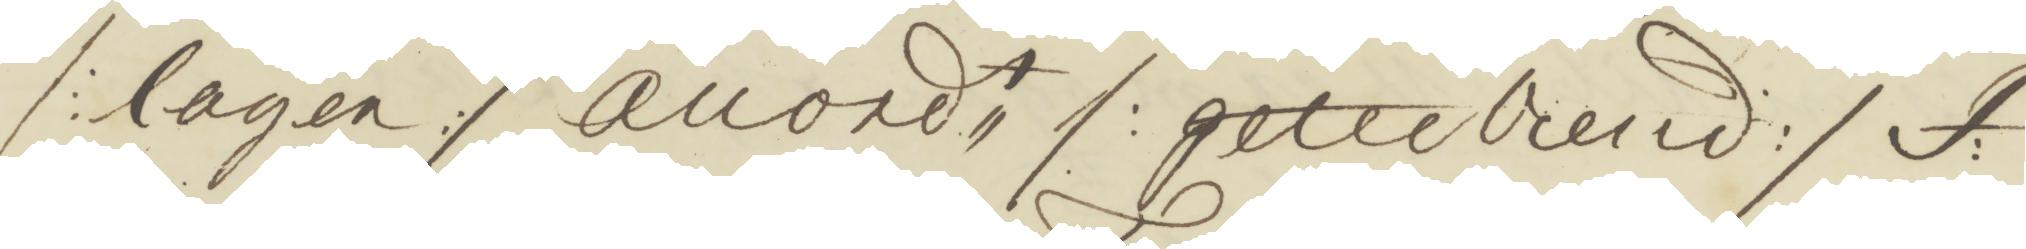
/:lager:/ accord„t /:geteekend:/ I:
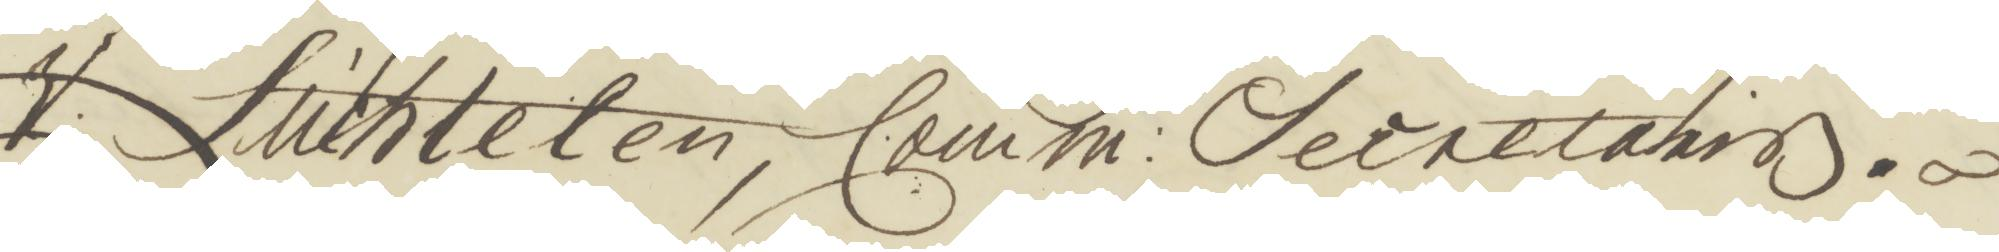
V: suchtelen, Comm: secretaris. —
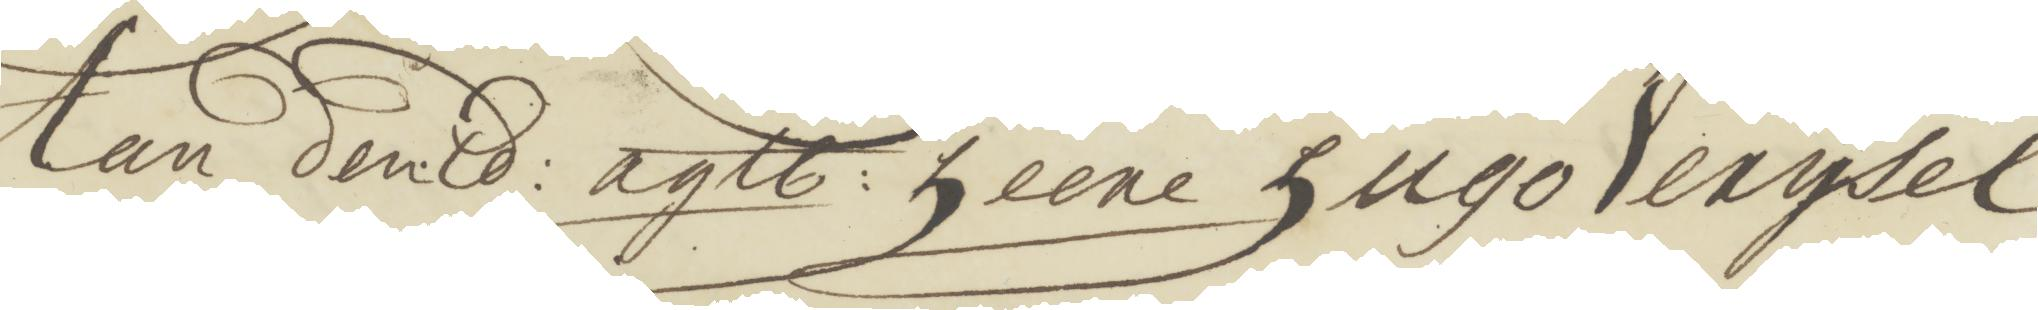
Aan den Ed: agtb: Heere Hugo Verijsel
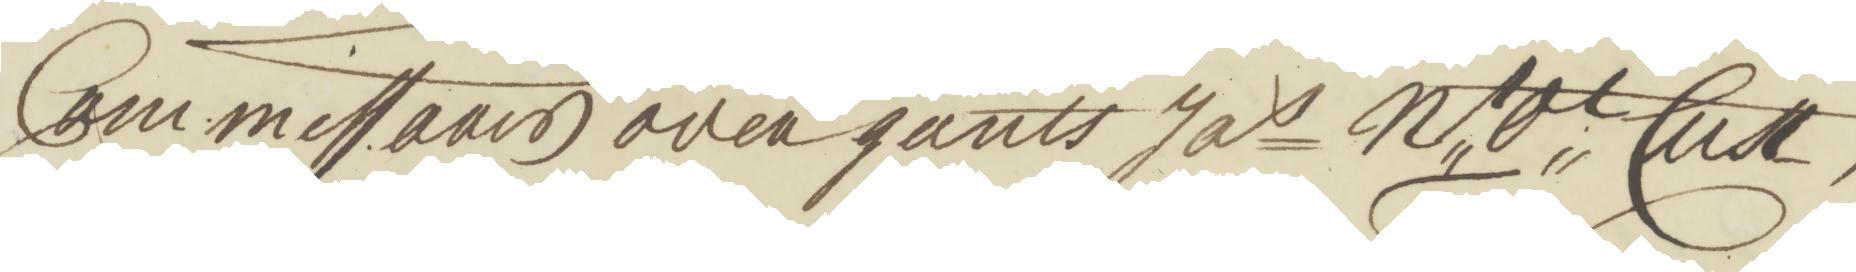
Commissaris over gants Ja=s N„t O„t Cust,
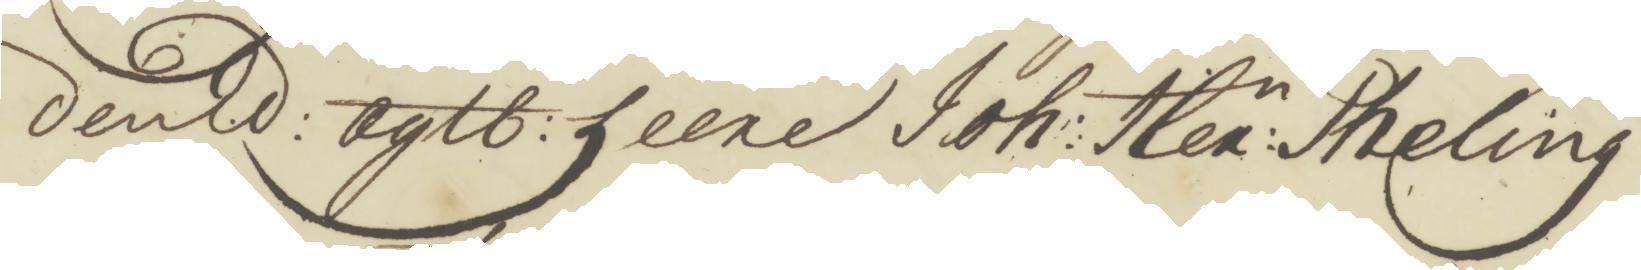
den Ed: agtb: heere Ioh: Her:n Theling
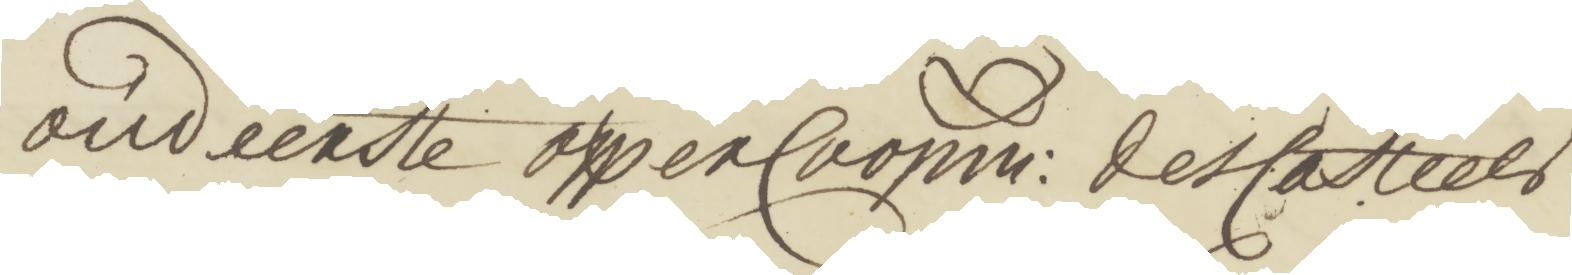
oud eerste oppercoopm: des Casteels
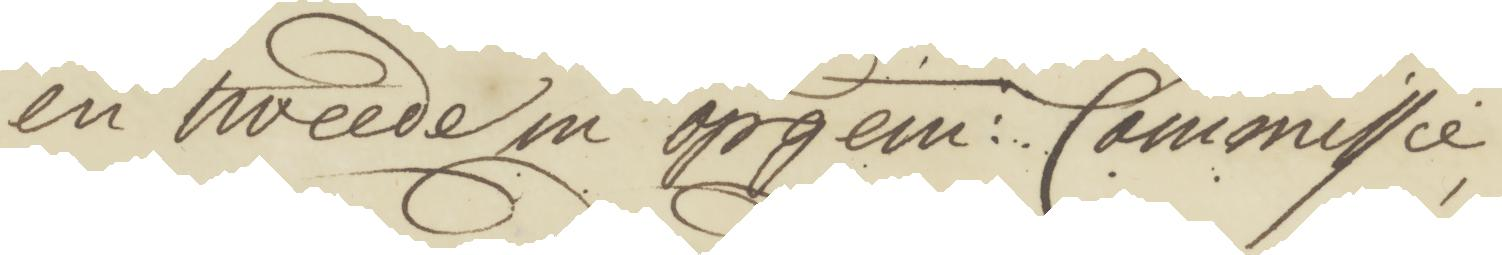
en tweede in opgem: Commissie,
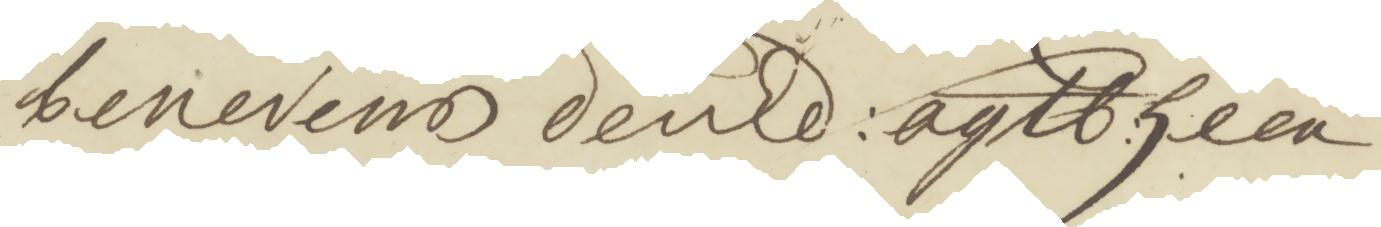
benevens den Ed: agtb: heer
